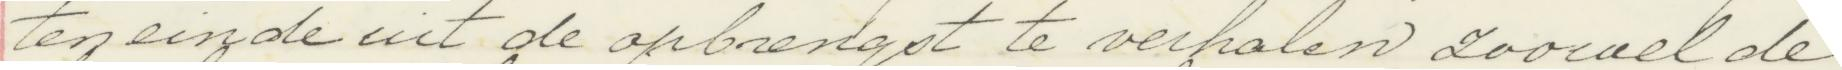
ten einde uit de opbrengst te verhalen zoowel de
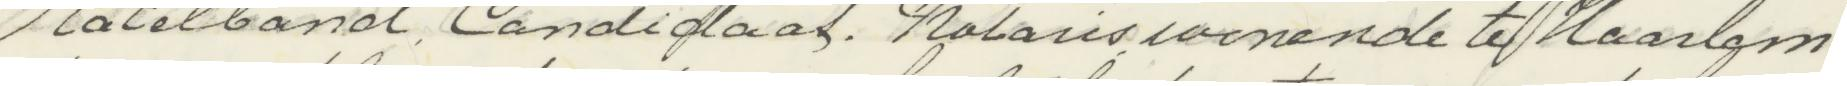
Ratelband, Candidaat. Notaris, wonende te Haarlem
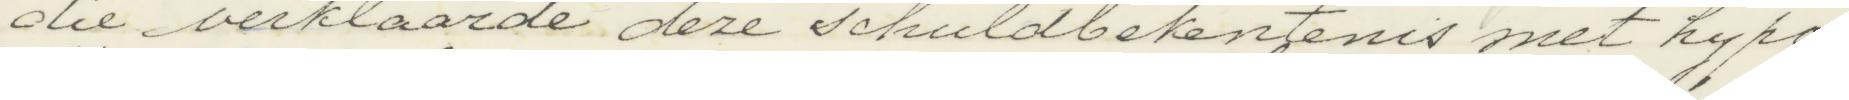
die verklaarde deze schuldbekentenis met hypo
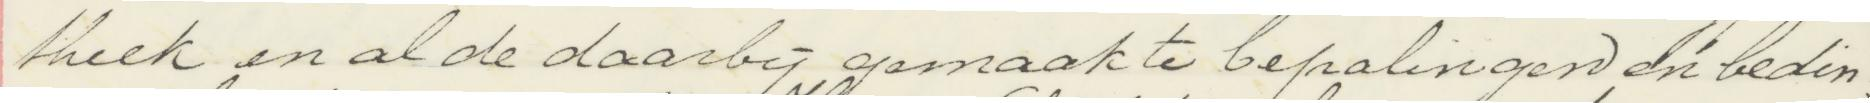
theek en al de daarbij gemaakte bepalingen en bedin
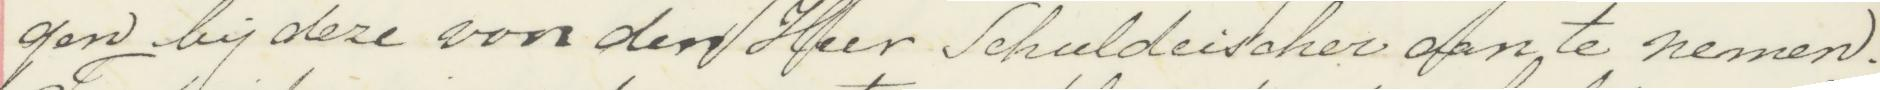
gen bij deze voor den Heer Schuldeischer aan te nemen.
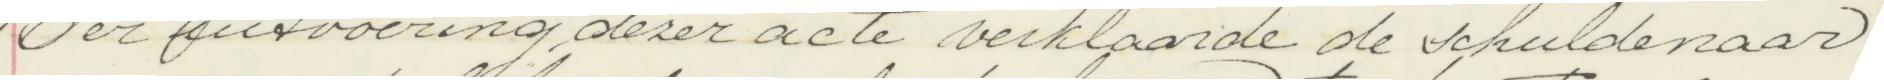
Ter uitvoering dezer acte verklaarde de schuldenaar
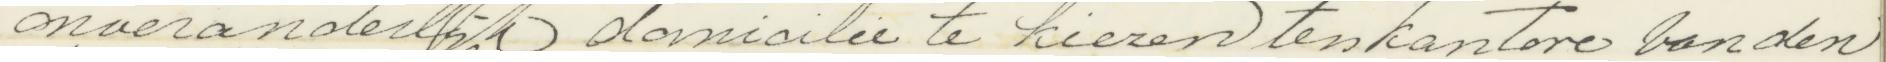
onveranderlijk domicilie te kiezen ten kantore van den
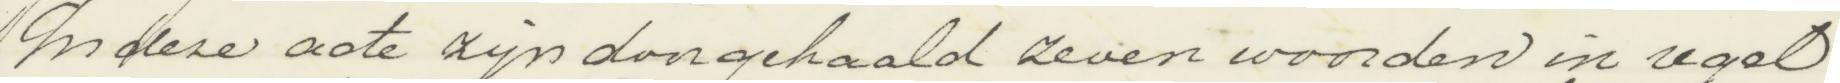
In deze acte zijn doorgehaald zeven woorden in regel
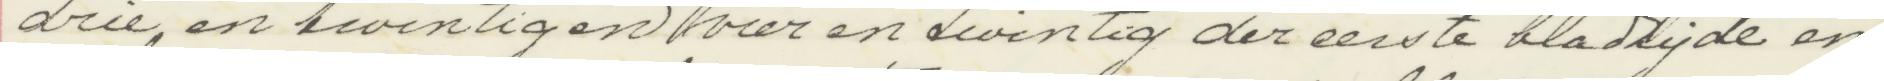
drie en twintig en vier en twintig der eerste bladzijde en
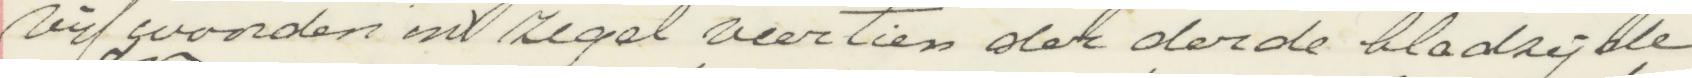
vijf woorden in regel veertien der derde bladzijde
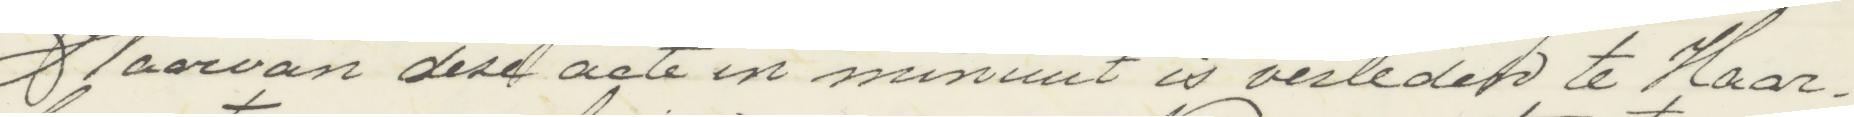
Waarvan deze acte in minuut is verleden te Haar-
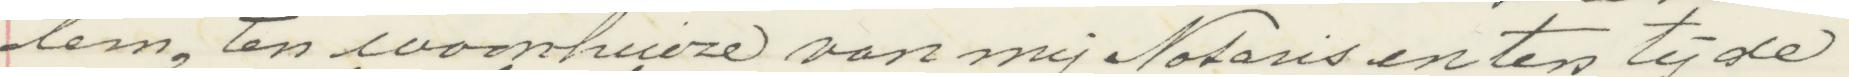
lem, ten woonhuize van mij Notaris en ten tijde
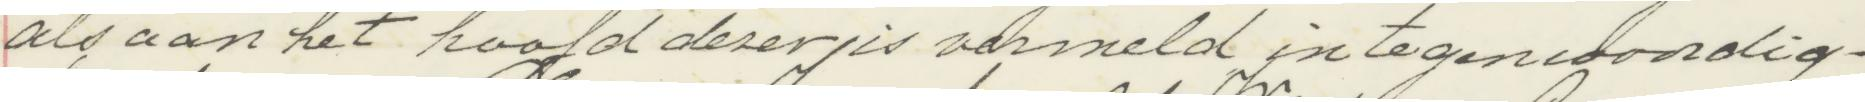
als aan het hoofd dezer is vermeld in tegenwoordig
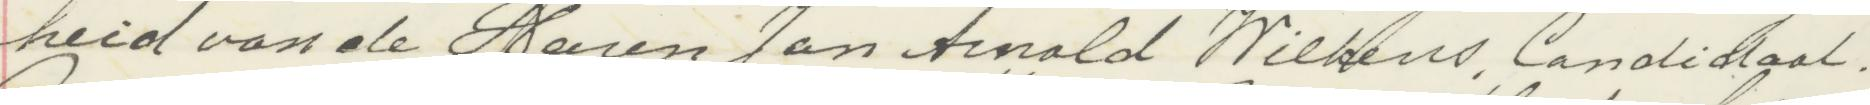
heid van de Heren Jan Arnold Wilkens, Candidaat
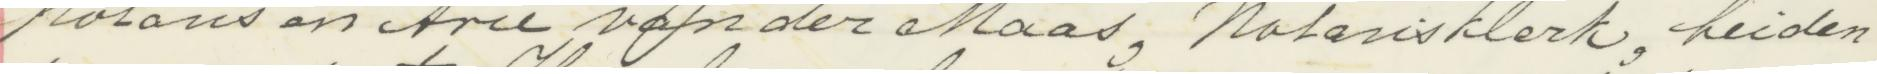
Notaris en Arie van der Maas, Notarisklerk, beiden
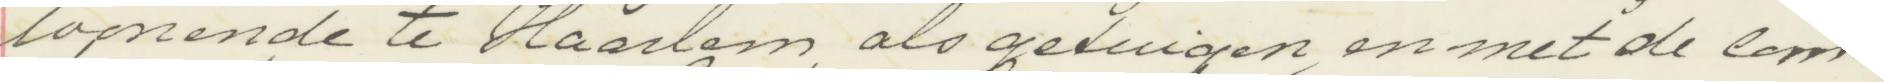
woonende te Haarlem als getuigen, en met de com-
